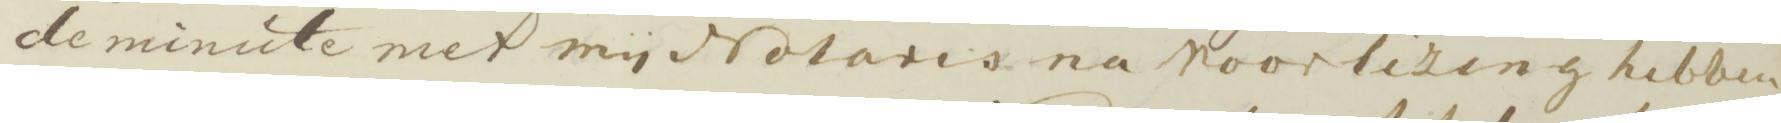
de minute met mij Notaris na Voorlezing hebben
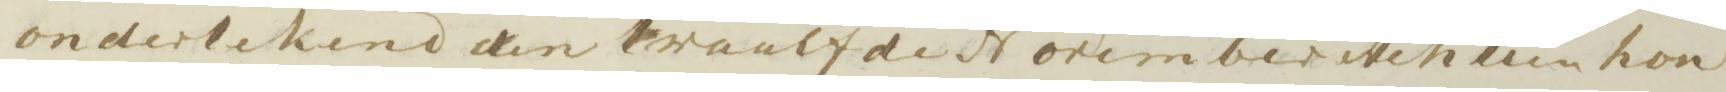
ondertekend den twaalfde November Achtien hon
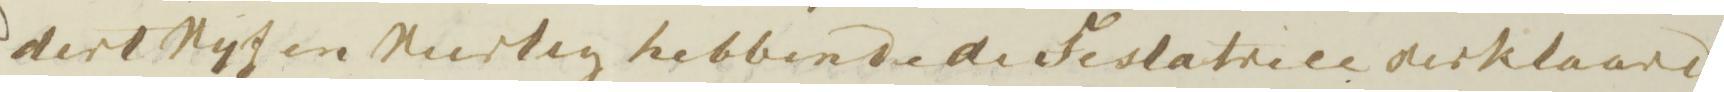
dert Vijf en Veertig hebbende de Testatrice verklaard
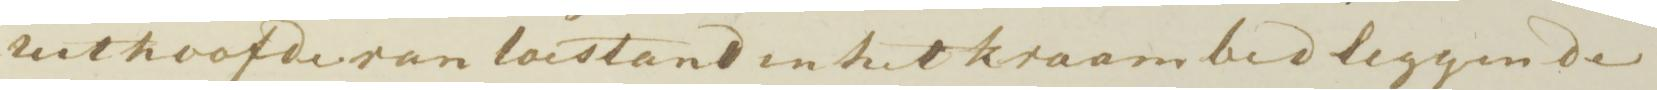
uithoofde van toestand in het kraam bed leggende
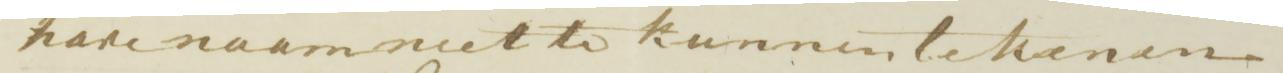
hare naam niet te kunnen tekenen
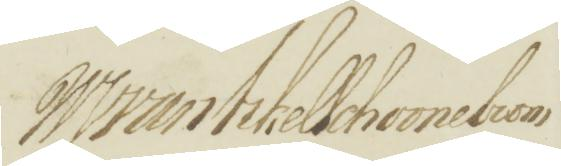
W: J van Arkelschoonebrom
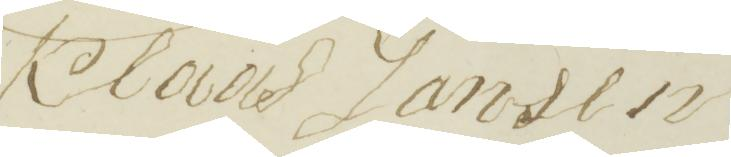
Klaas Jansen
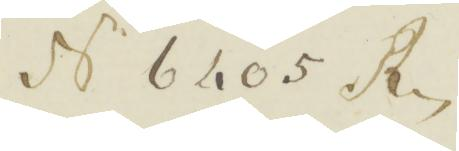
N 6405 Re,
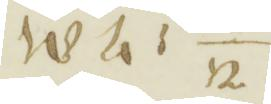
1845 11/12
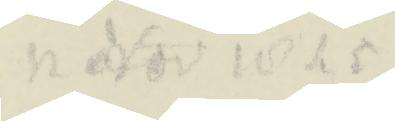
12 Nov 1845
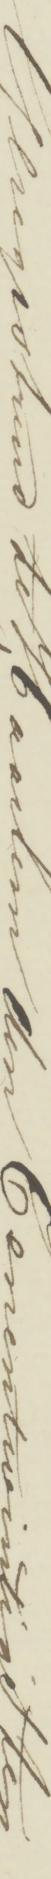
Geregistreerd teHaarlem den Eenentwintigsten
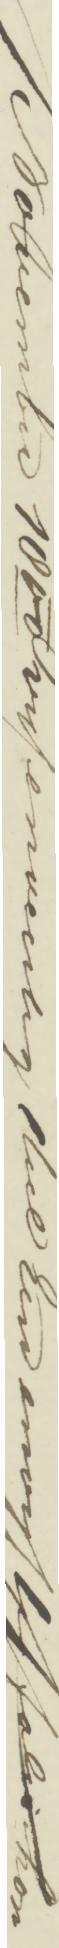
November 1800 vyfenveertig deel Een envyftig folio hon
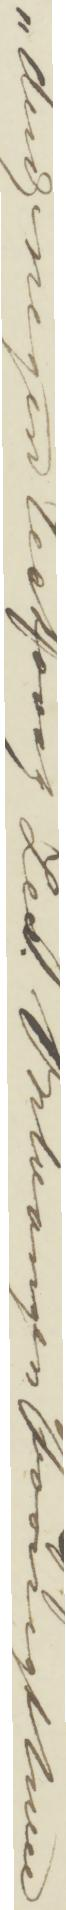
„derd negen Rectovak Zes. Ontvangen voorregttwee
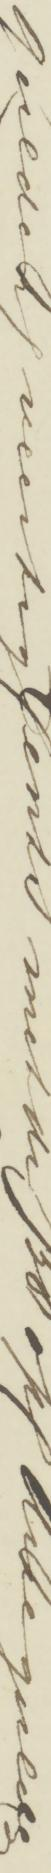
Gulden veertig Cents met de 38 opC drie gulden
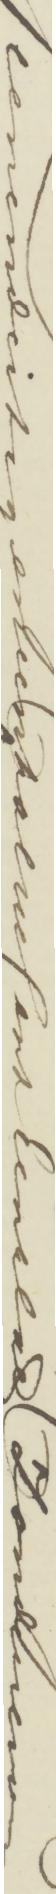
eenendertig eneenhalve Cent Eenblad Zonderrenvooi
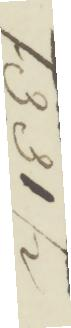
ƒ3. 31½
